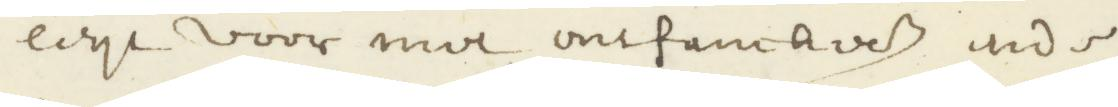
leyt voor niet ontfanckelijk inde
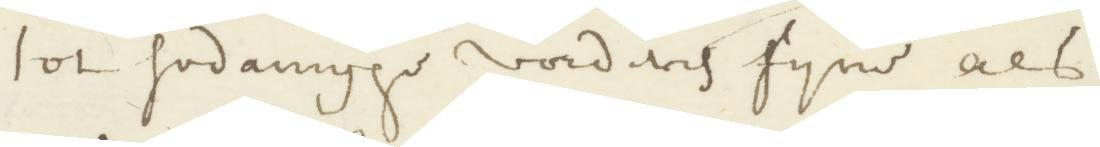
tot sodanighe vorderen fyne als
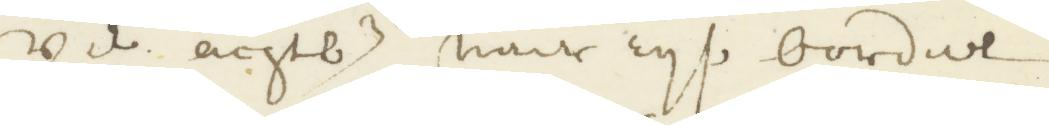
V E. achtben naer ryp oordeel
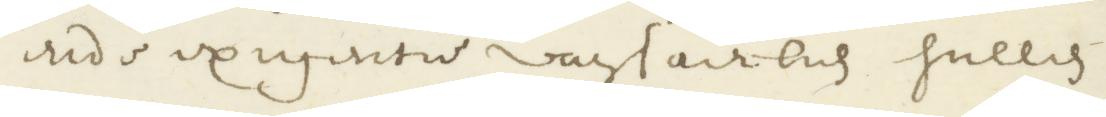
ende exigentie van saeken sullen
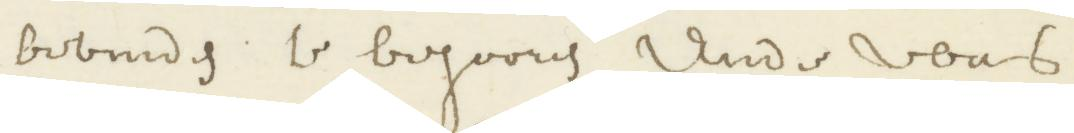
bevinden te behooren Ende was
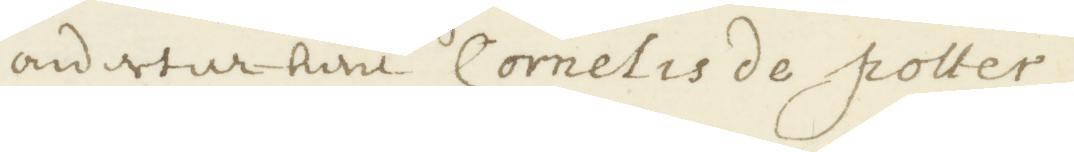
onderteeckent Cornelis de potter,
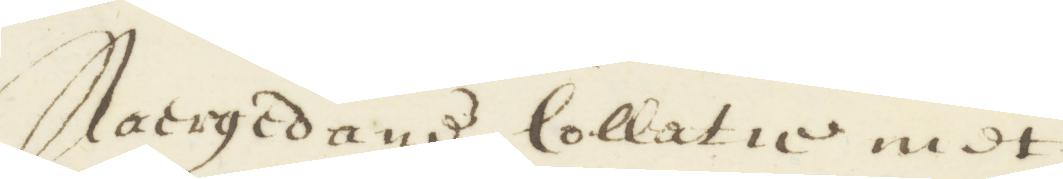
Naergedane Collatie met
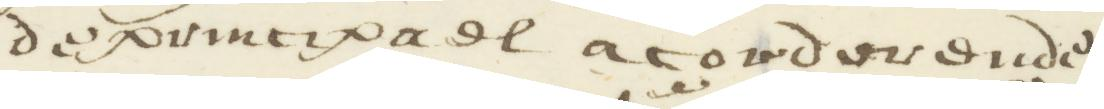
de principael acorderende
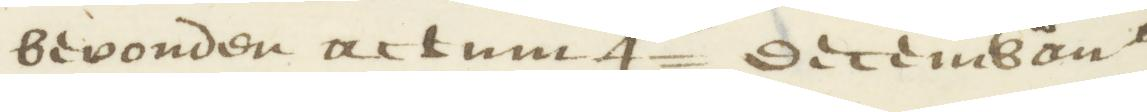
bevonden actum 4=e decembr ano
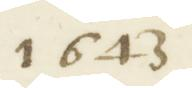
1643
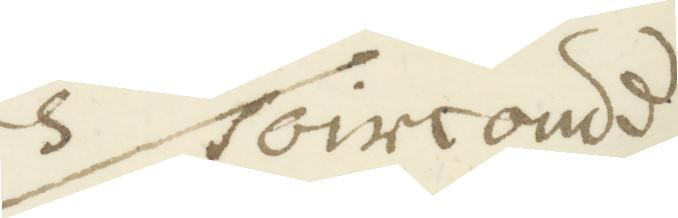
Des T oirconde
